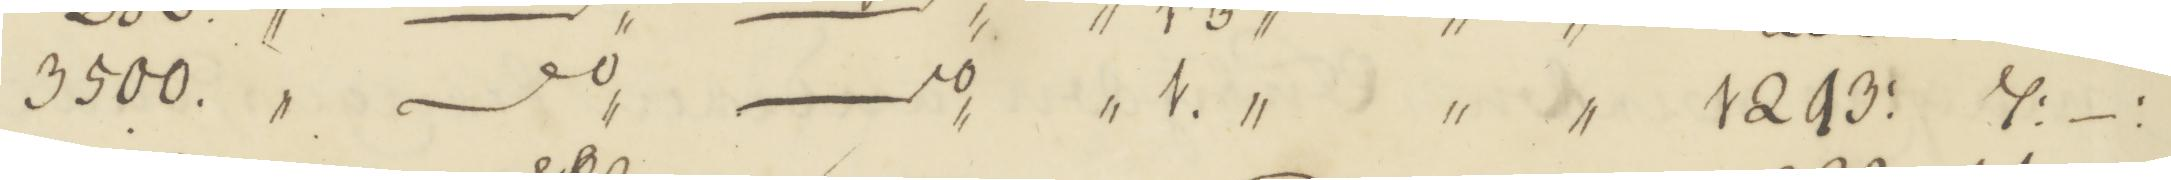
3500. „ _„o _„o „ 1. „ „ „ 1243: 7: —:
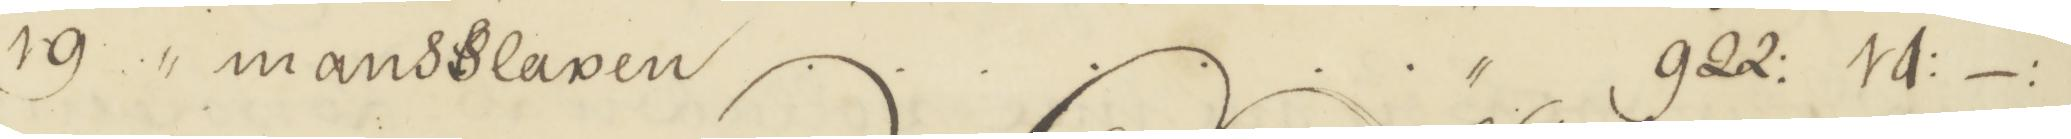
19 „ mansslaven . . . . . . . „ 922: 14: —:
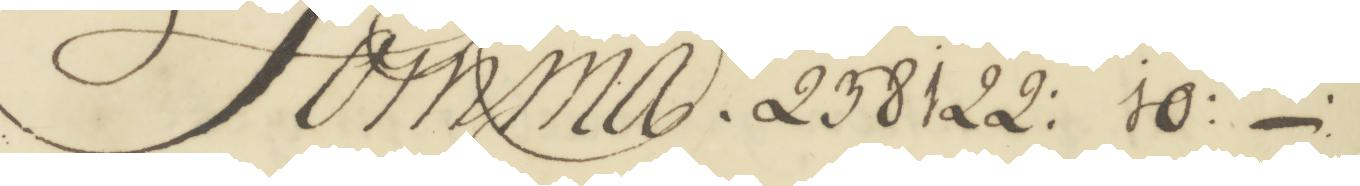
Somma. 238122: 10: —:
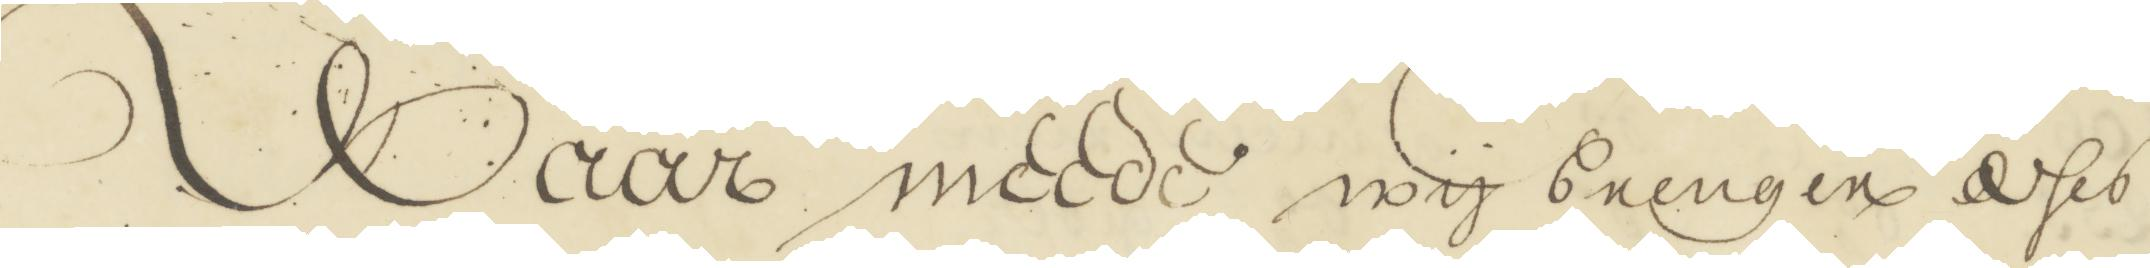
Waar meede wij brenger deses
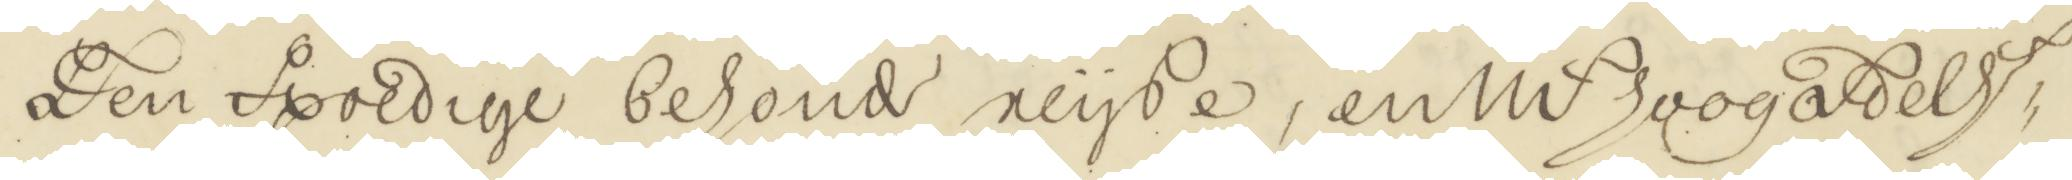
Een spoedige behoude reijse, en UE hoog Edelh„s
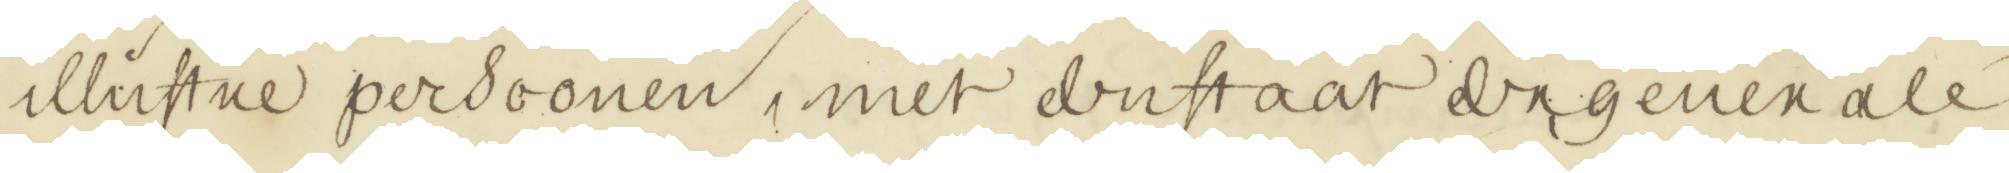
illustre persoonen, met den staat der generale
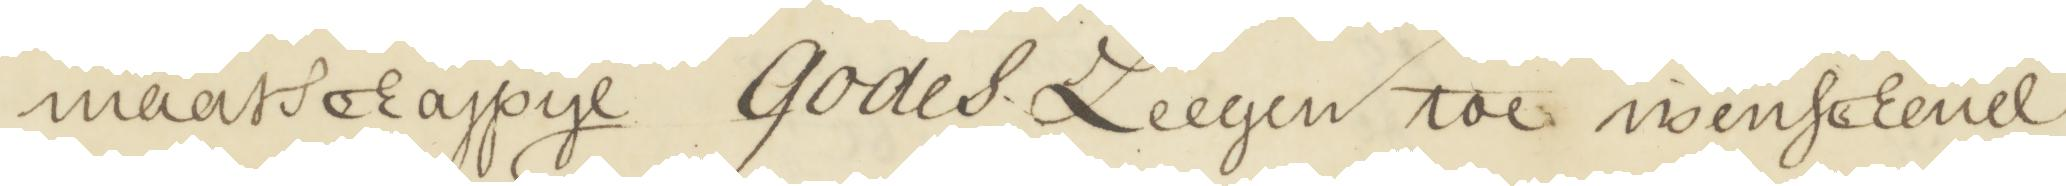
maatschappije Godes Zeegen toe wenschend
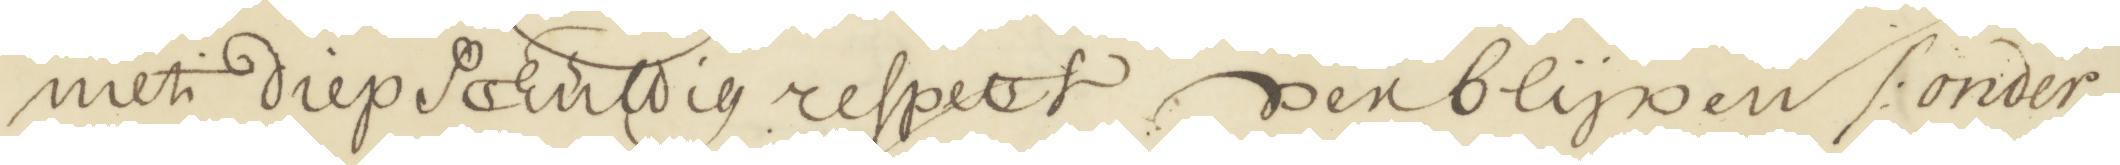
met diep schuldig respect verblijven /:onder
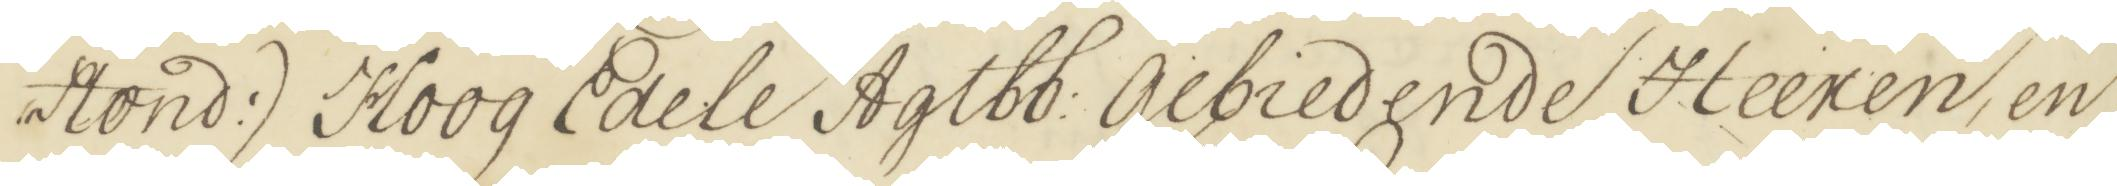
„stond:) Hoog Edele Agtbb: gebiedende Heeren, en
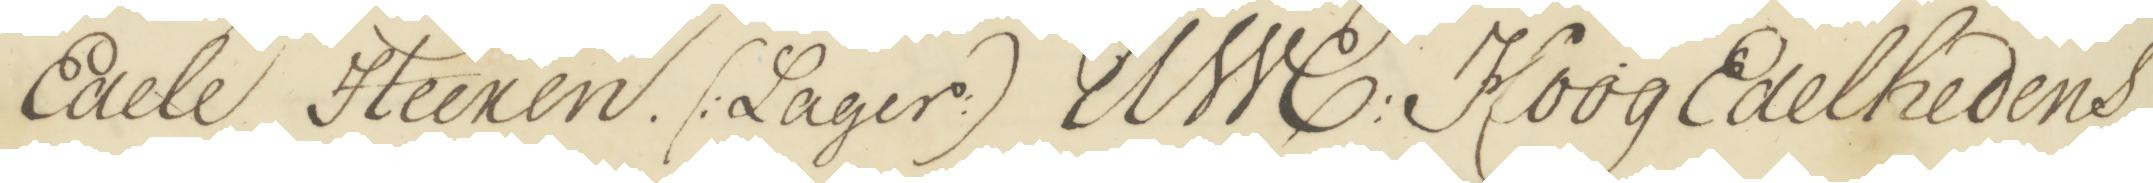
Edele Heeren. (:Lager:) UWE: Hoog Edelhedens
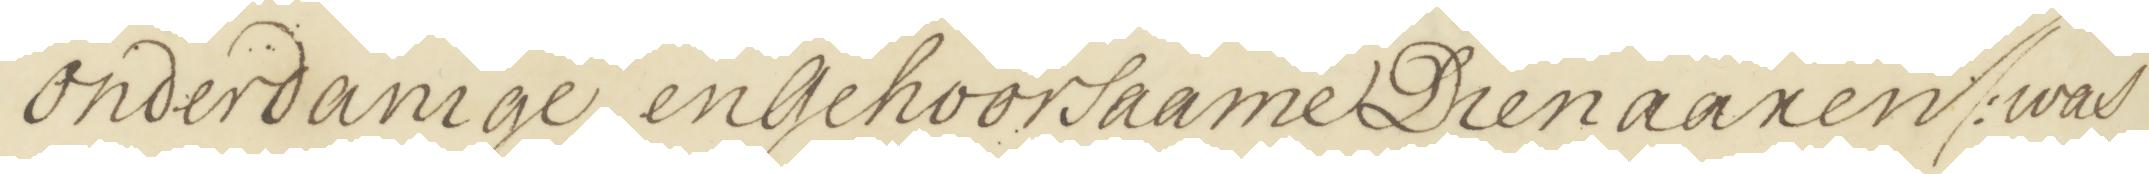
onderdanige, en gehoorsaame Dienaaren (:was
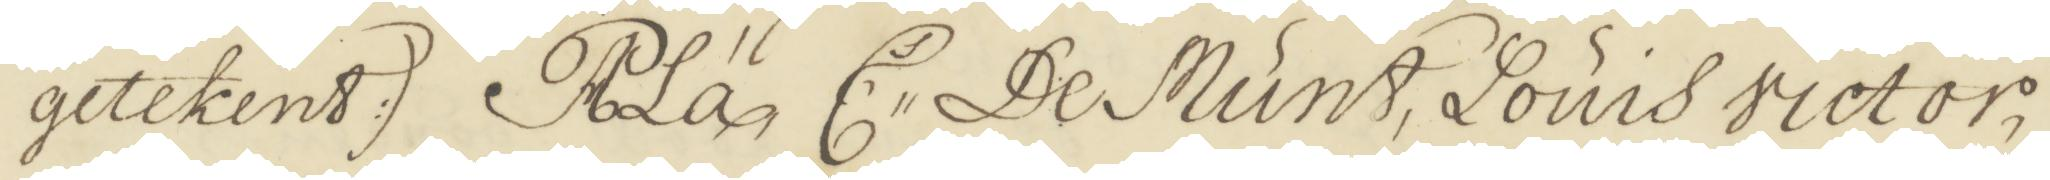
getekent:) Plá C„s De Munt, Louis victor,
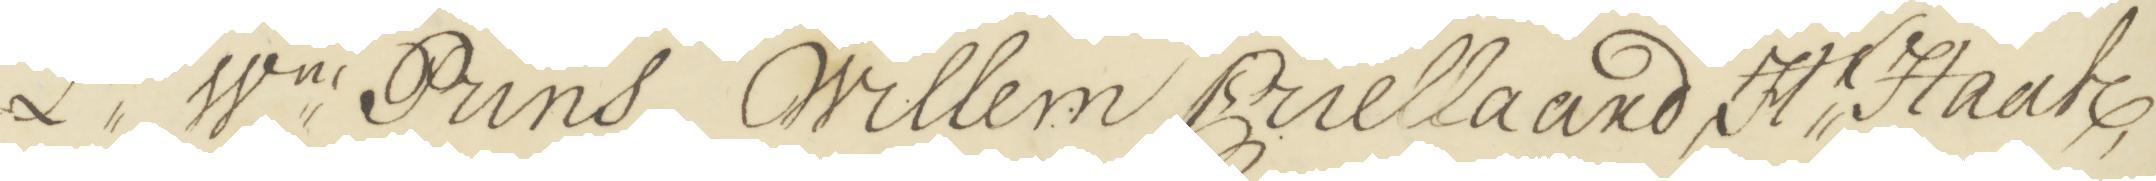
L„k W„m Prins, Willem Criellaard, H„k Haak,
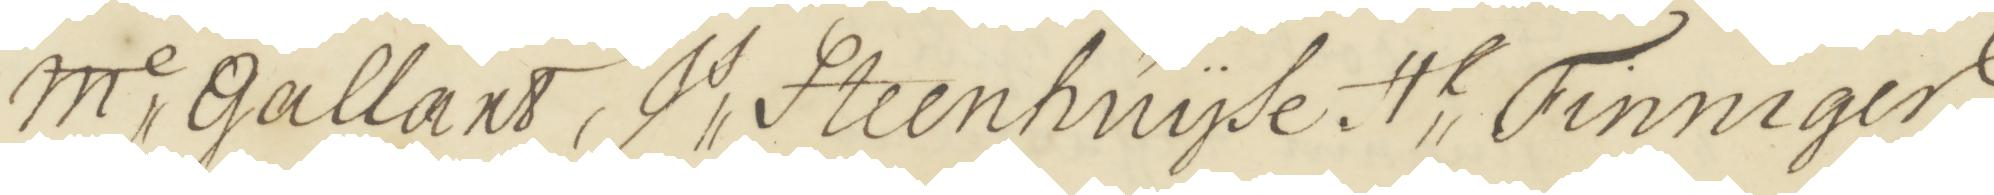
m„l Gallart, J„s Steenhuijse H„k Tinniger,
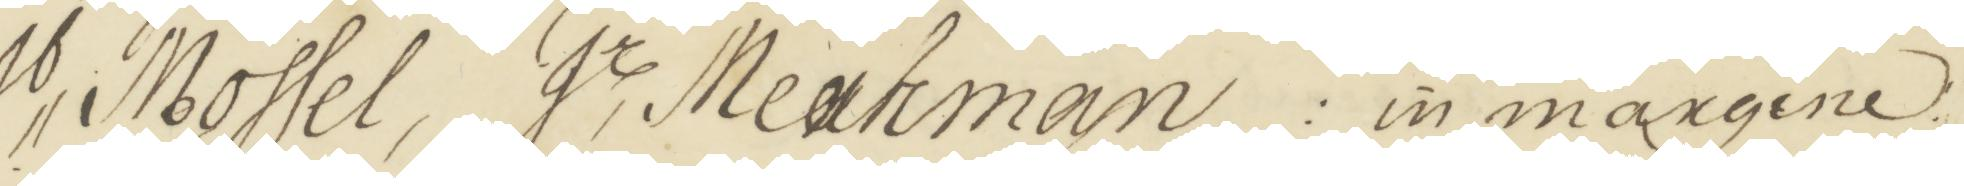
J„b Mossel, J„r Merkman (:in margine:
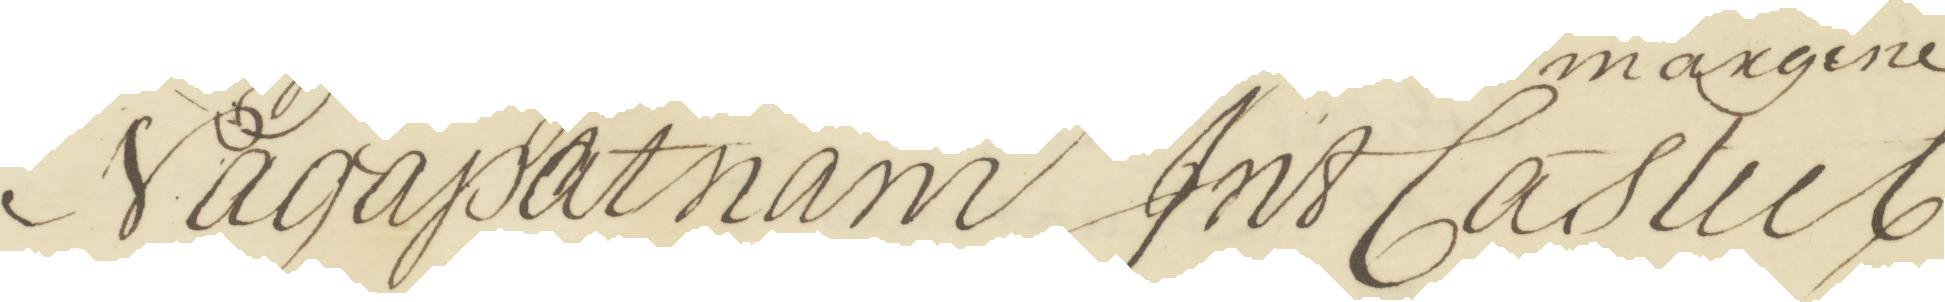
Nagapatnam Jnt Casteel
